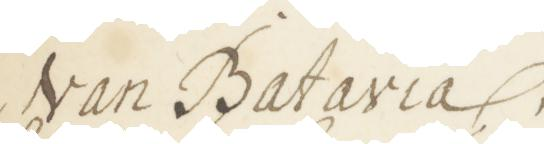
Van Batavia
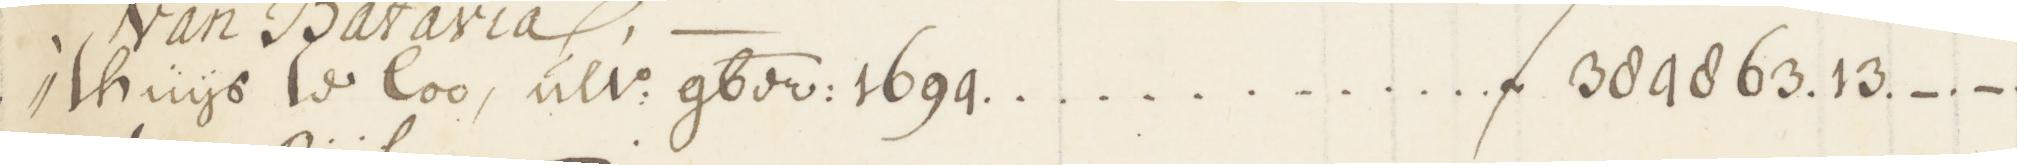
„ 'thuijs te loo, ult:o 9ber: 1694. . . . . . . . . . . ƒ384863.13.-.-.
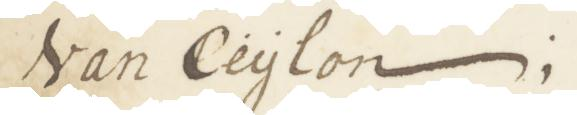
van Ceijlon;
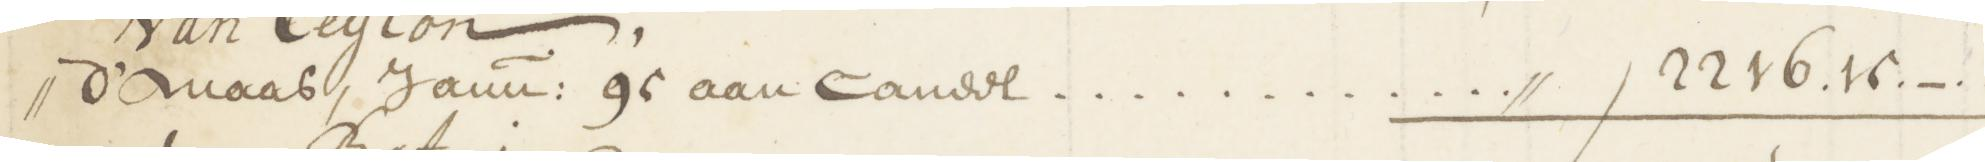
„ d’ maas, Jann: 95 aan caneel . . . . . . . . . . . . „ 2216.15.-.
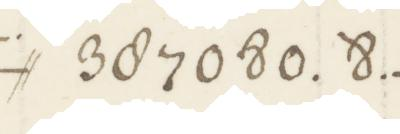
„ 307080.8.
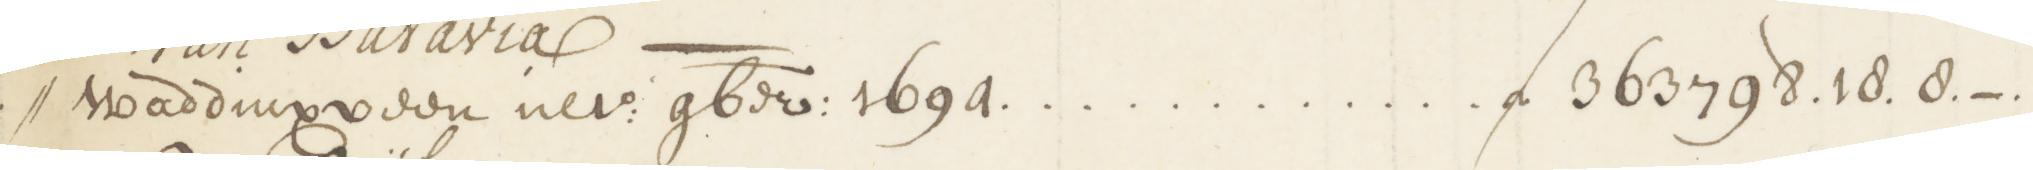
„ Waddinxveen ult:o 9ber: 1694. . . . . . . . . . . . ƒ363798.18.8.-.
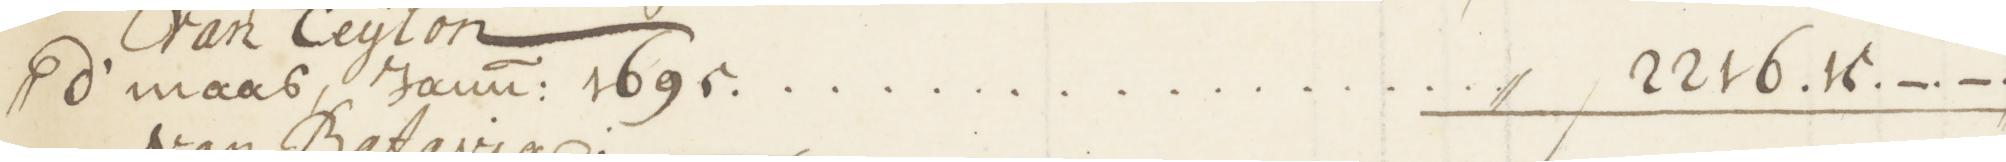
d’ maas, Janu: 1695. . . . . . . . . . . . . . . . . . „ 2216.15.-.-.
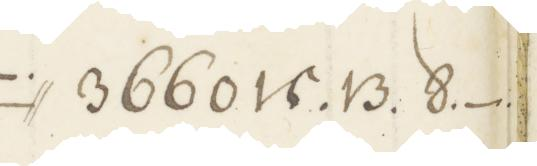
„ 366015.13.8.-.
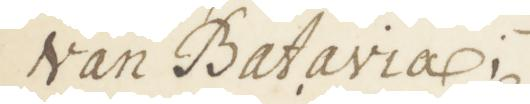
van Batavia;
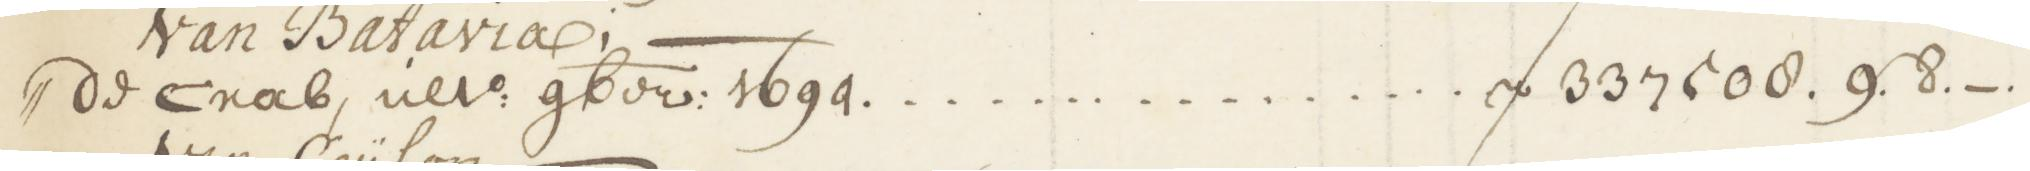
„ de Crab, ult:o 9ber: 1694. . . . . . . . . . . . . . . . ƒ 337508.9.8.-.
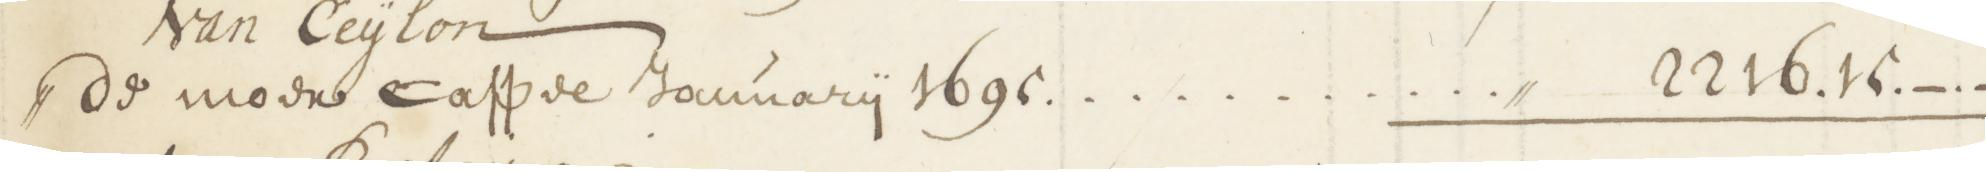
„ de moer cappel Januarij 1695. . . . . . . . . . . „ 2216.15.-.-.
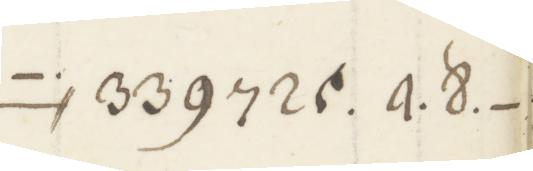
-.„339725. 4.8.-
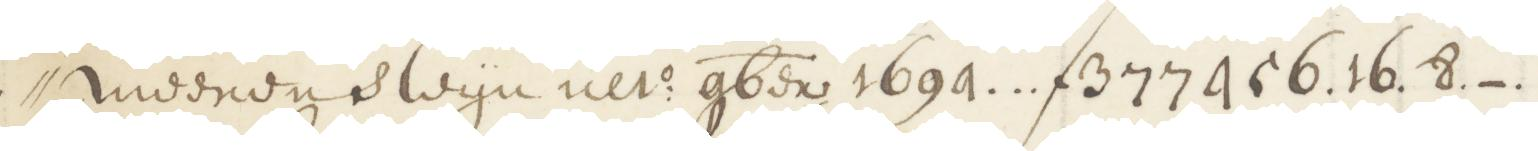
„ meenen steijn ult:o 9ber 1694. . . ƒ377456.16.8.-.
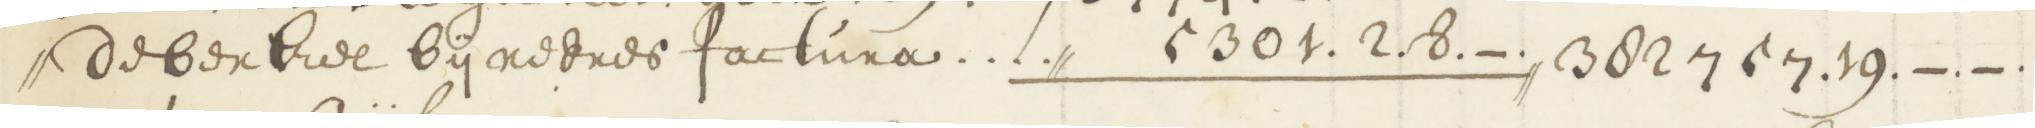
„ deberkel bij redres factura . . . . „ 5301.2.8-.-.„38275719.-.-.
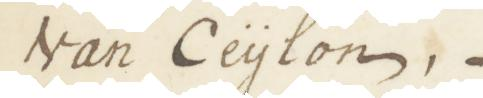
van Ceijlon,
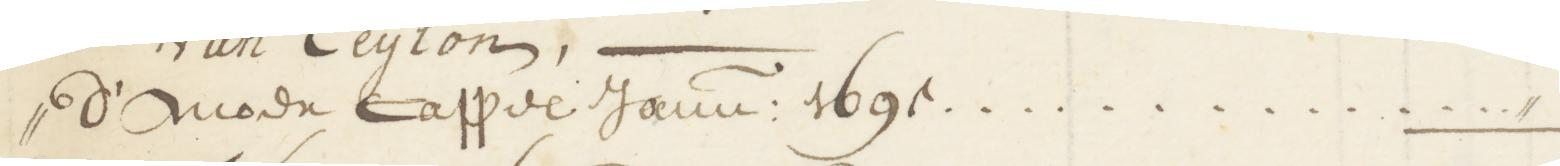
„ d’ moer cappel Janu: 1695 . . . . . . . . . . . . . . „
